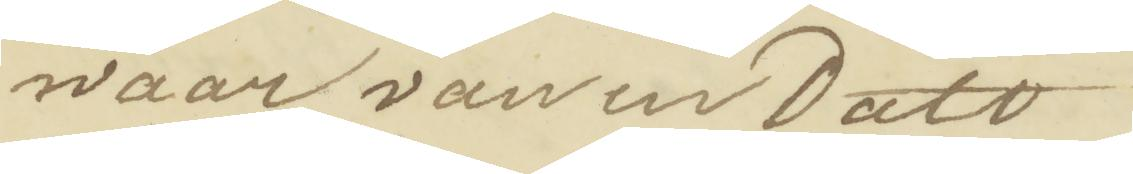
waar van in Dato
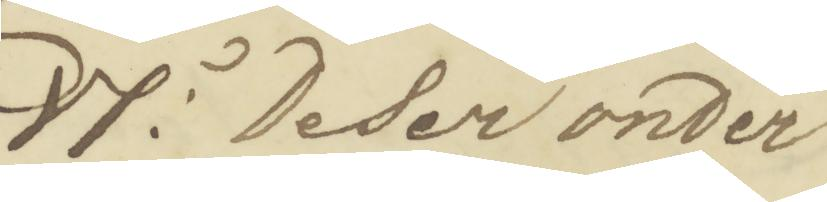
17: Deser onder
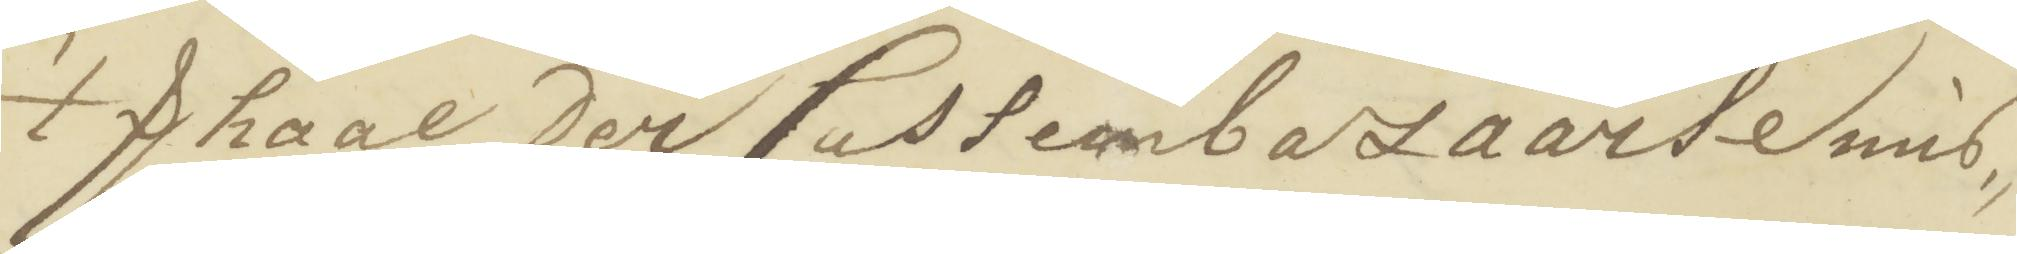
’t verhaal der Cassembazaarse mis„
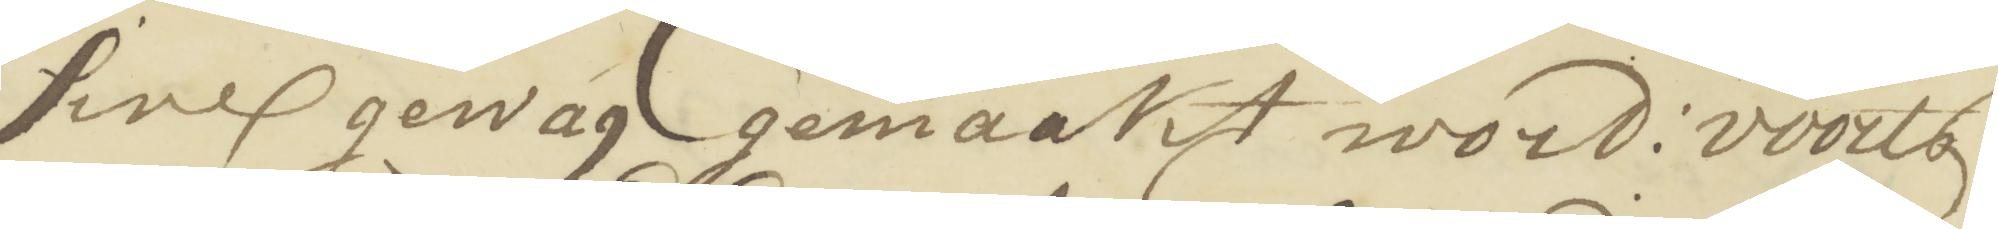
sive gewag gemaakt word: voorts
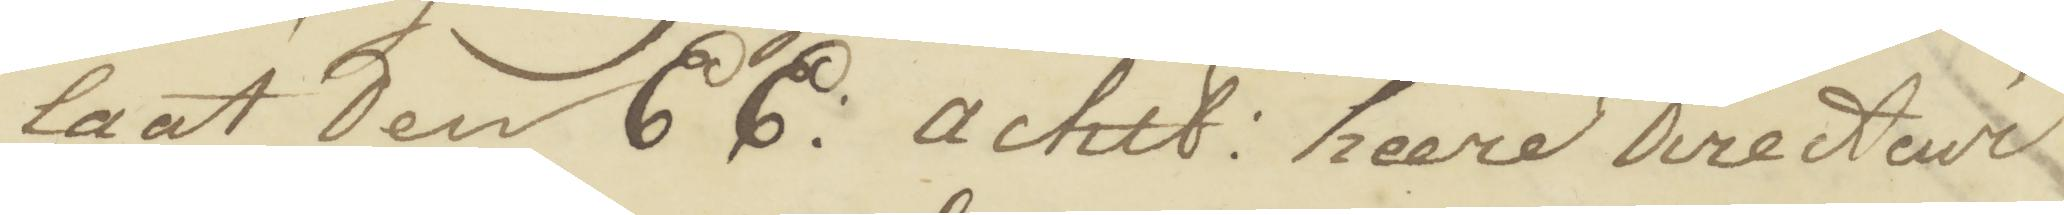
laat den E E: achtb: heere Directeur
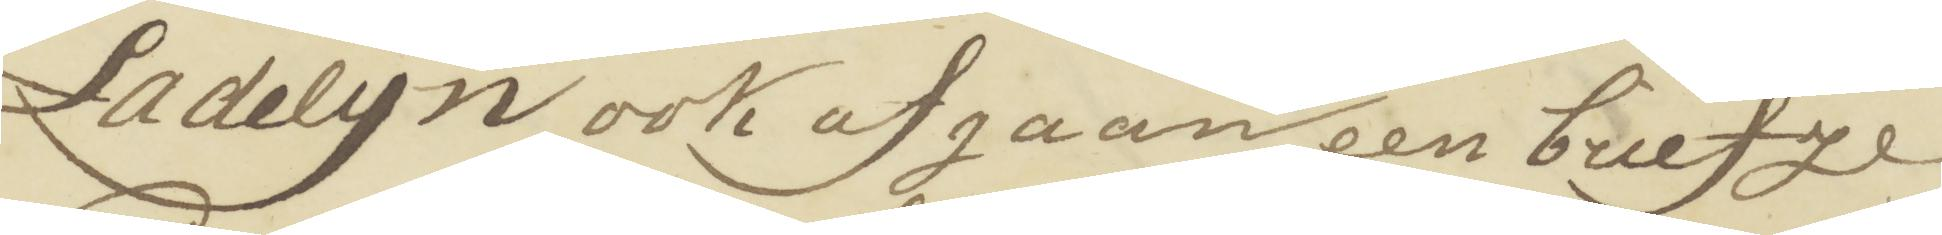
Sadelijn ook afgaan een briefje
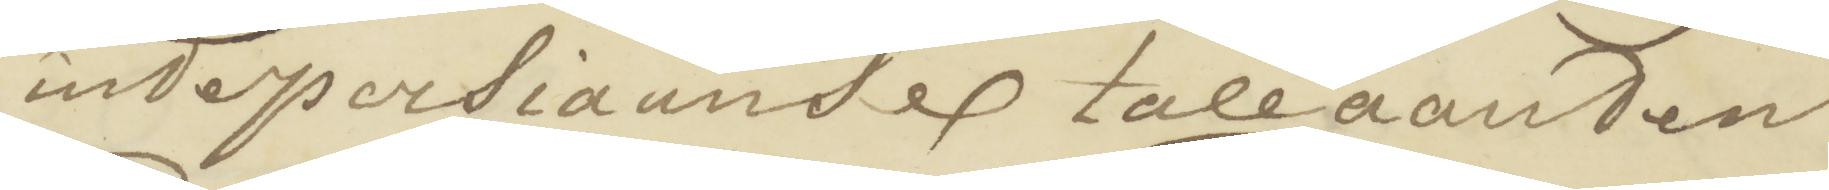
in de persiaanse tale aan den
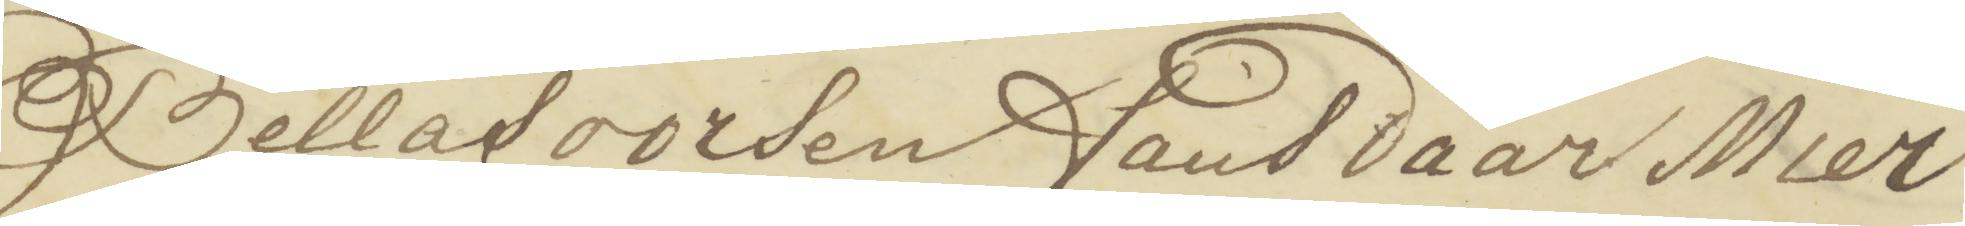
Bellasoorsen fausdaar Mier
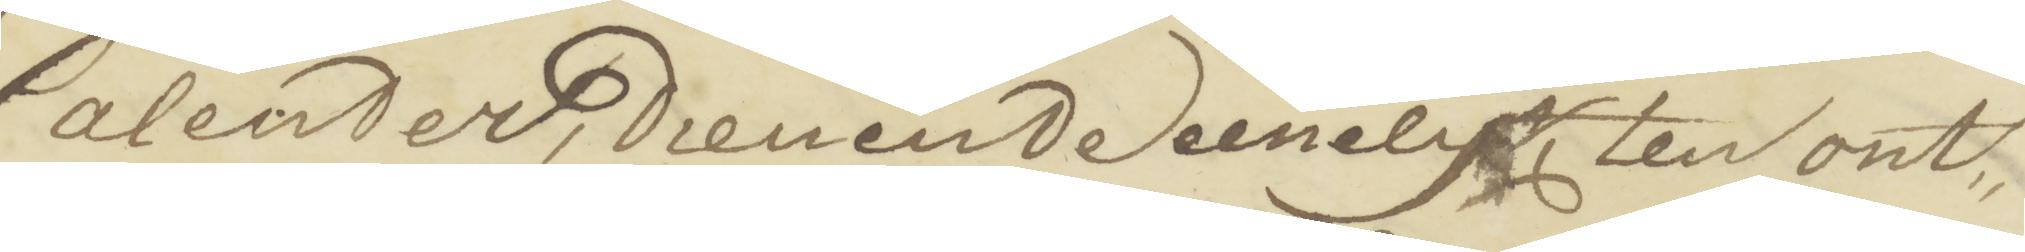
Calender, dienende eenelijk ten ont„
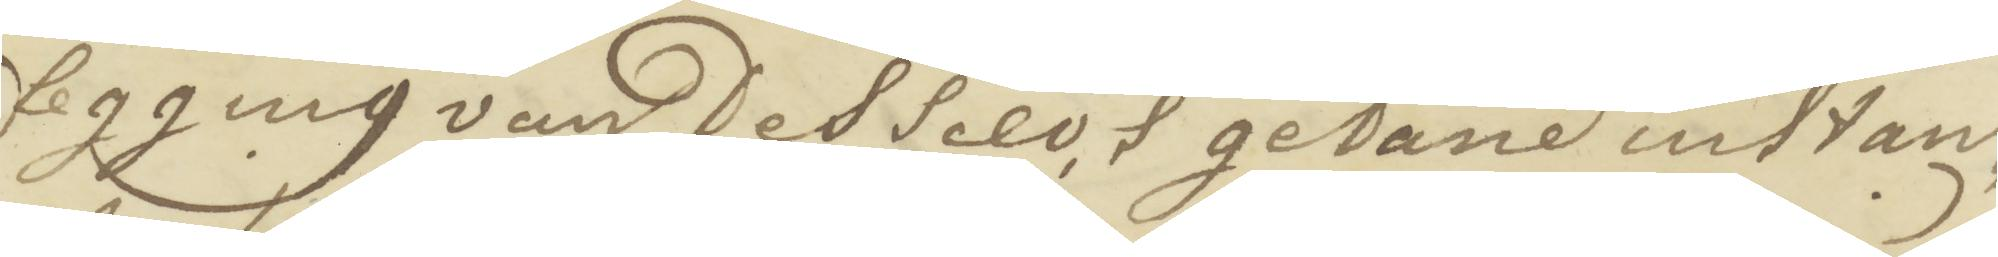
legging van desselvs gedane instan
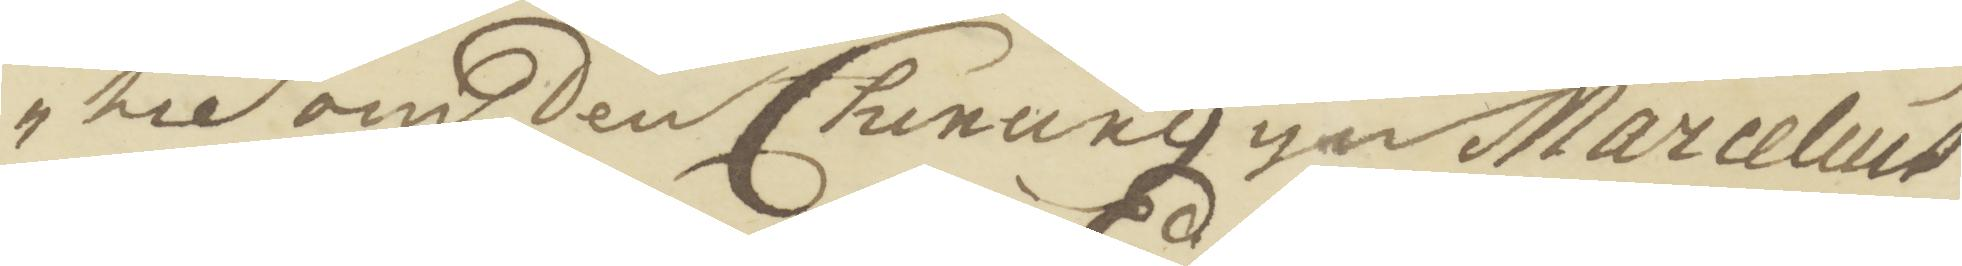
„tie om den Chirurgijn Marcelius
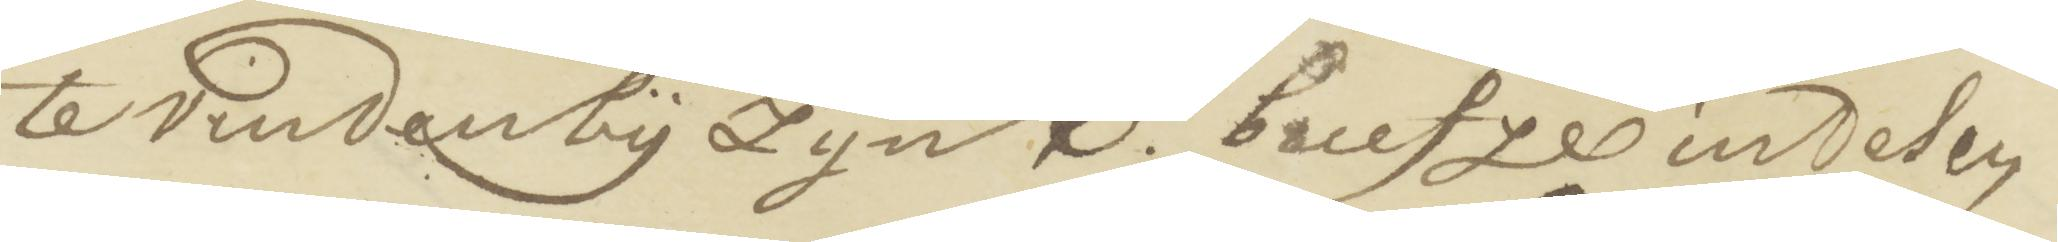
te vinden bij Zijn E. briefje in desen
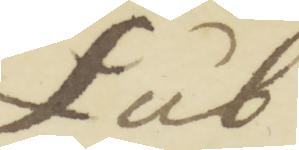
Sub
